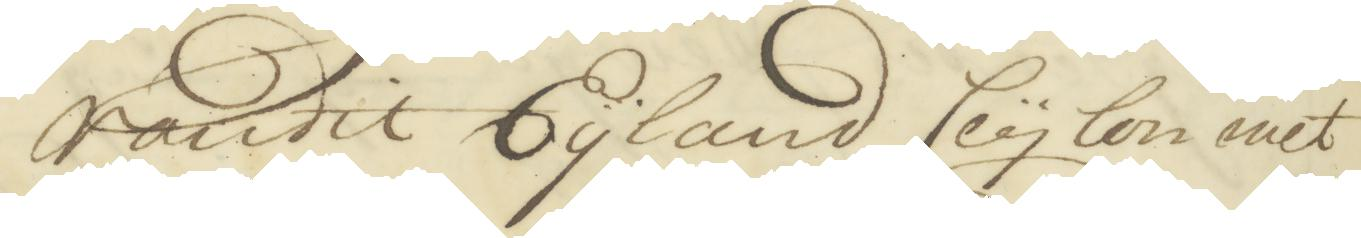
van dit Eijland Ceijlon met
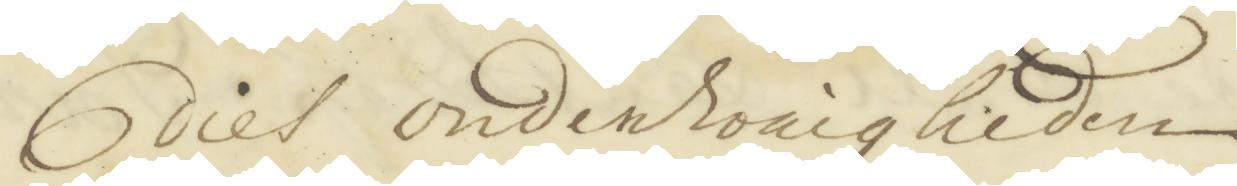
dies onderhorigheden
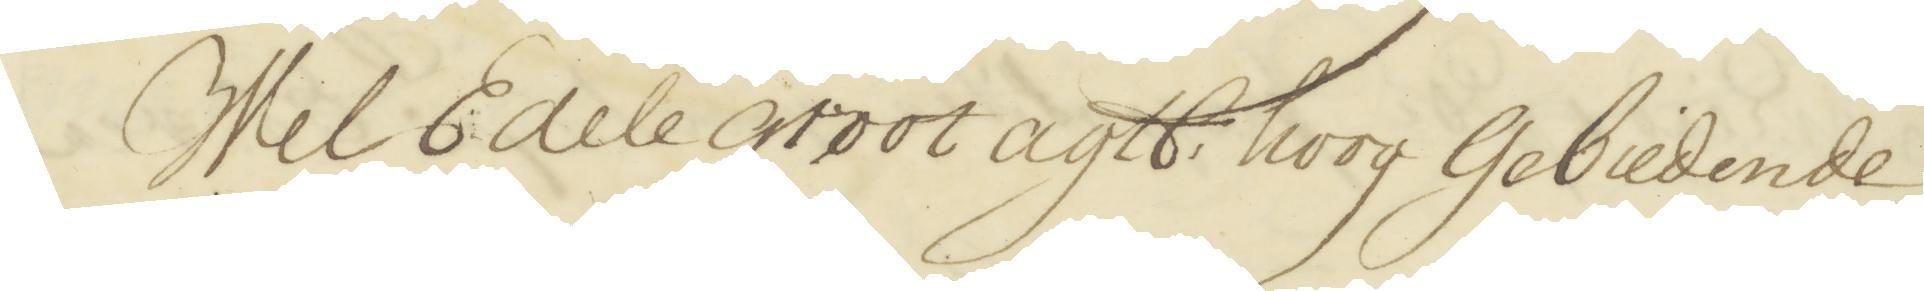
Wel Edele groot agtb: hoog Gebiedende
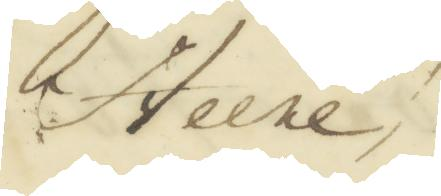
Heere,
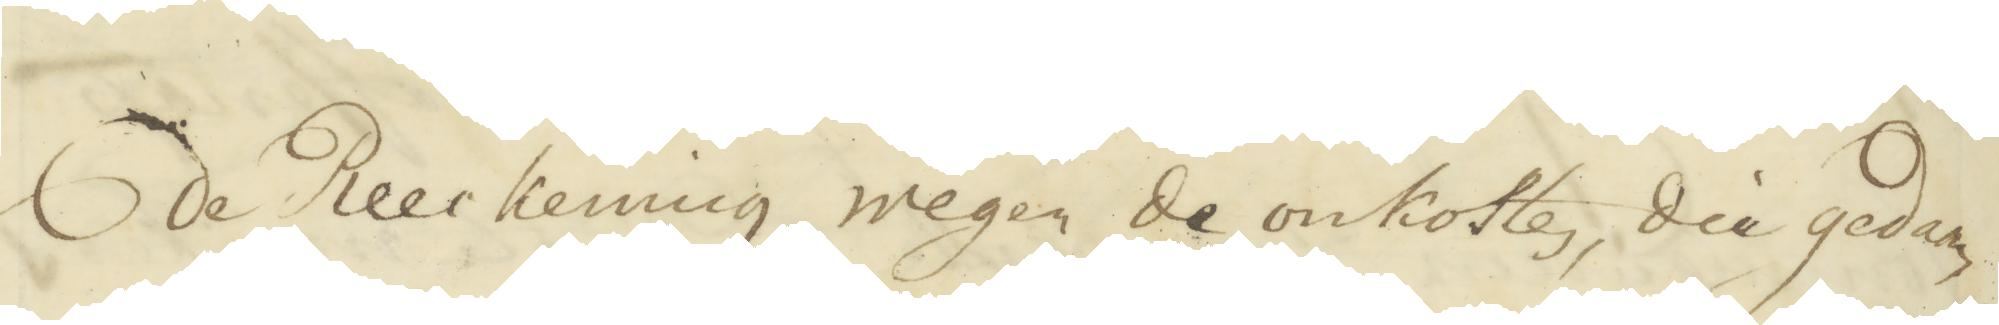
de Reeckening, wegen de onkosten, die gedaan
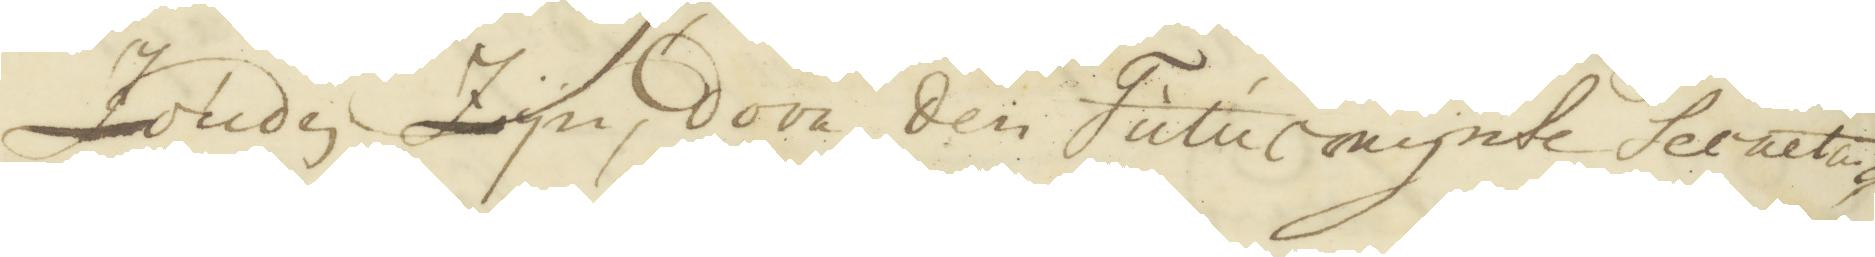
zouden zijn, door den Tutucorijnse secreta
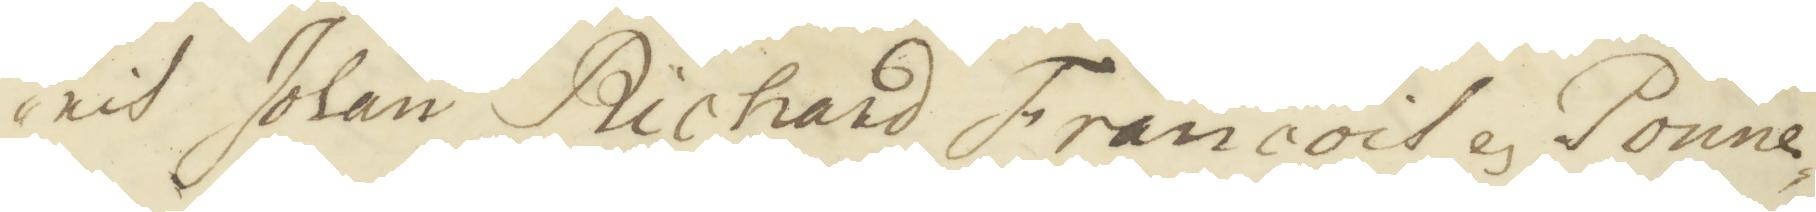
ris Johan Richard Francois en Ponne
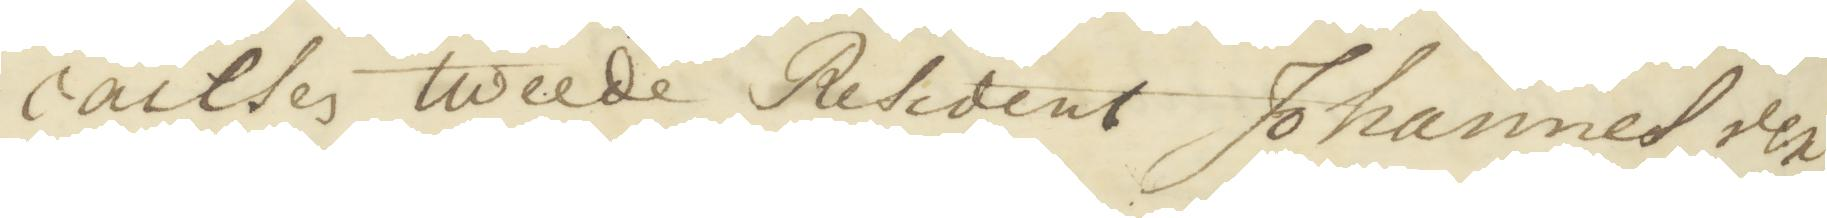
cailsen tweede Resident Johannes ver
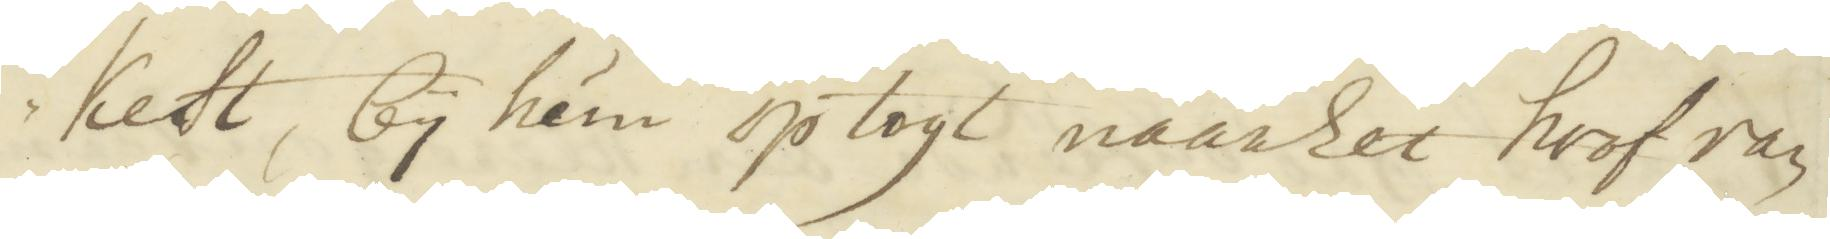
„kest, bij hem op togt naar het hoof van
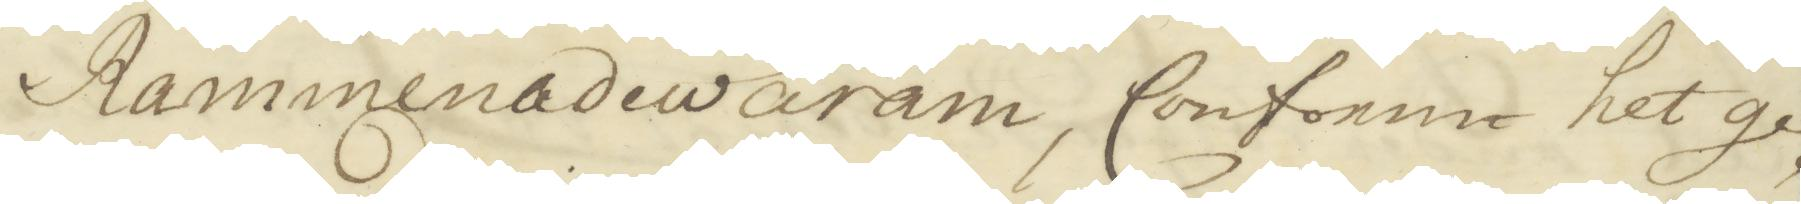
Rammenadew aram, Conforme het ge
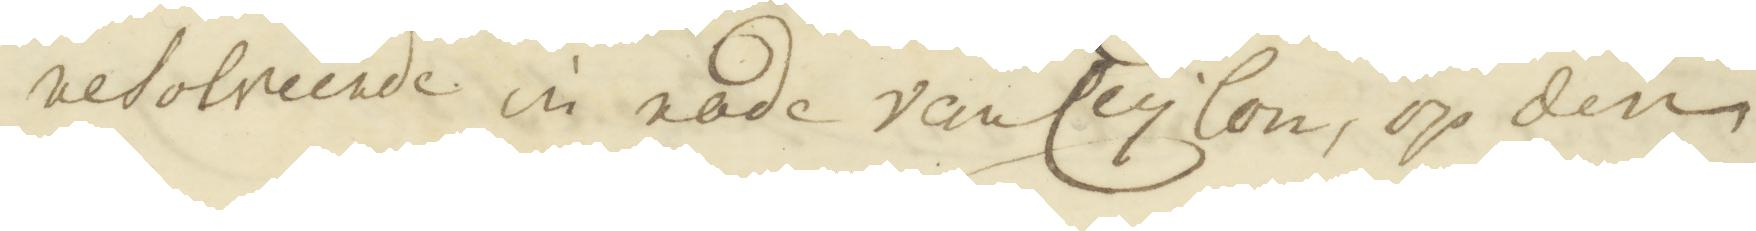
resolveerde in rade van Ceijlon, op den
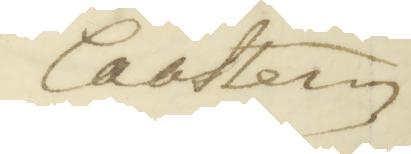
laasten
